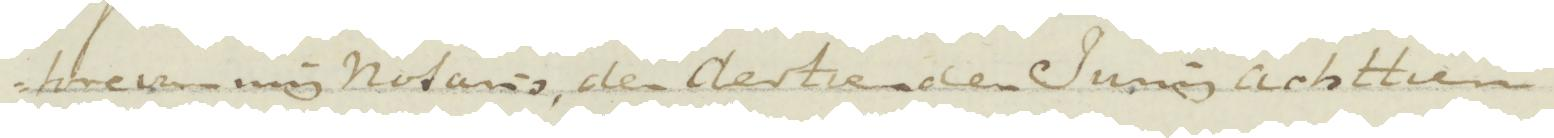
„tore van mij Notaris, den dertienden Iunij achttien
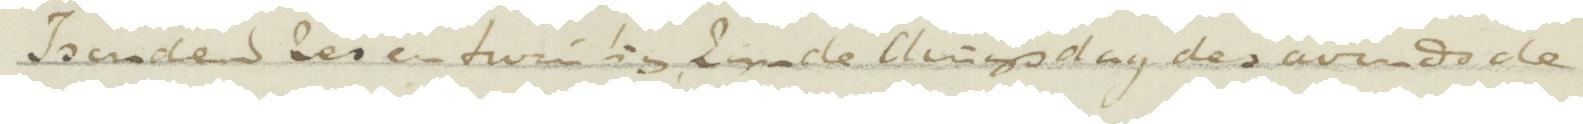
honderd zes en twintig zijnde dingsdag des avonds de
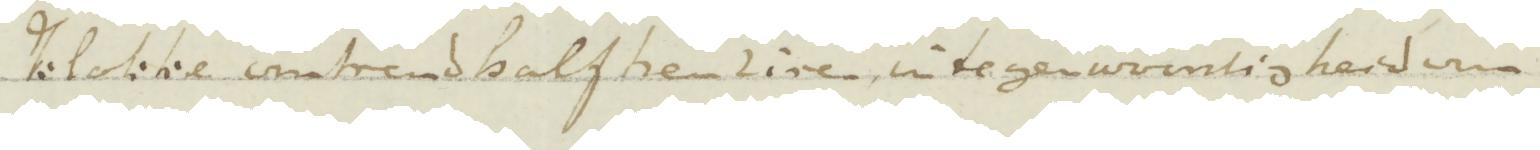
klokke omtrend half tien uren, in tegenwoordigheid van
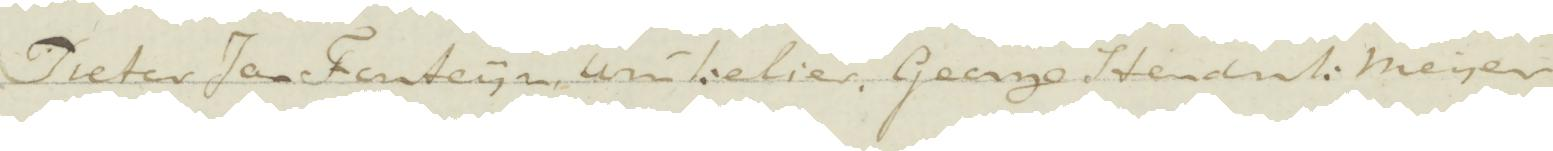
Pieter Jan Fonteijn, winkelier, George Hendrik Meijer
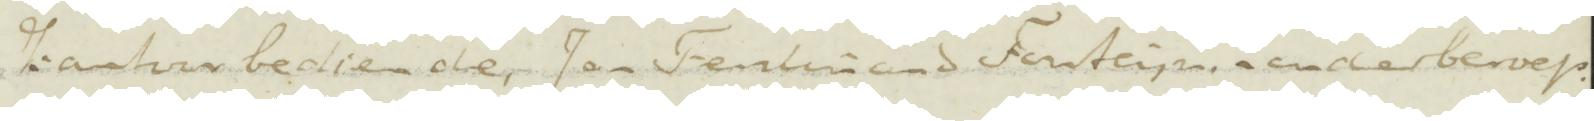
kantoorbediende, Jan Ferdinand Fonteijn, zonder beroep,
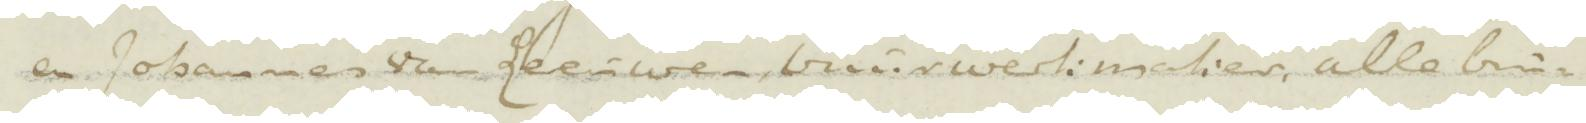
en Johannes van Leeuwen vuurwerkmaker, alle bin„
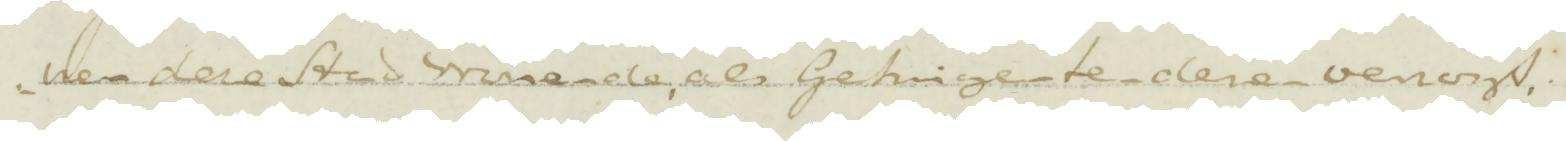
„nen deze stad wonende, als Getuigen ten dezen verzogt,:
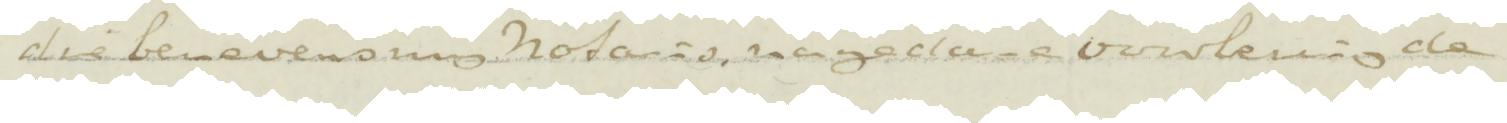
die benevens mij Notaris, na gedane voorlezing der
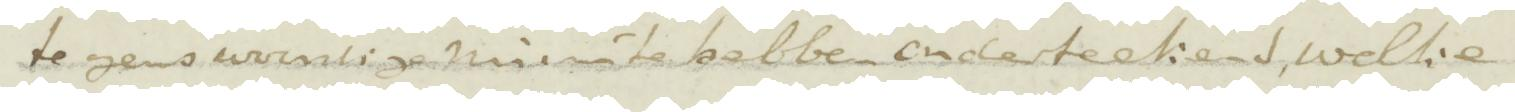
tegenswoordige minute hebben onderteekend, welke
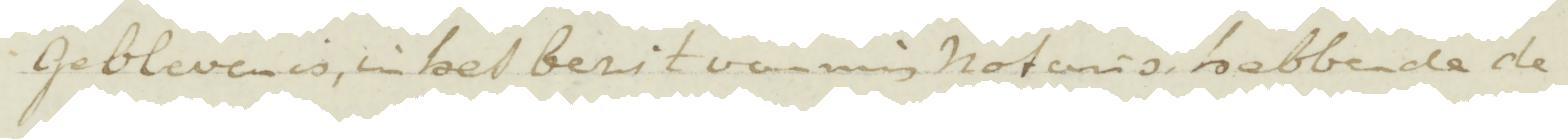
Gebleven is, in het bezit van mij Notaris, hebbende de
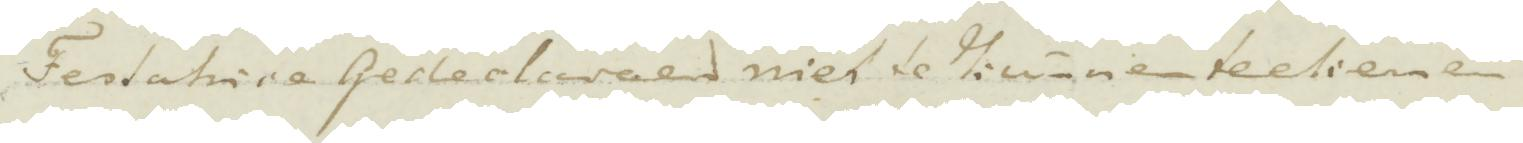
Testatrice Gedeclareerd niet te kunnen teekenen
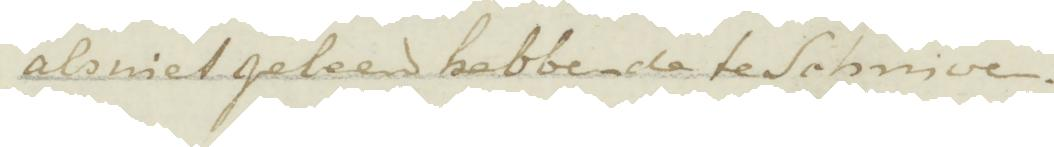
als niet geleerd hebbende te schrijven.
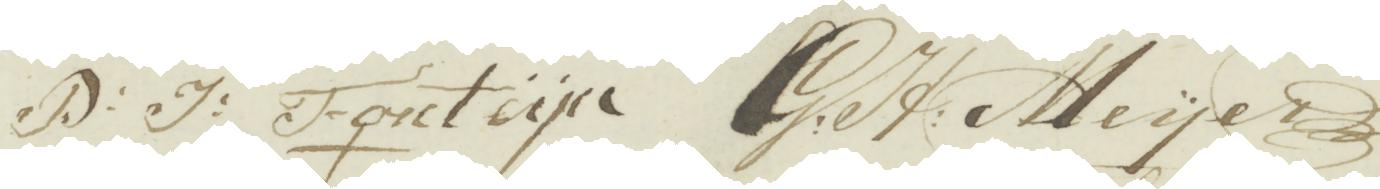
P: I: Fontijen G: H: Meijer
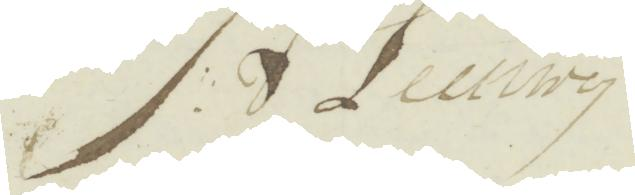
J: v Leeuwen
